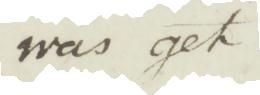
was get.
